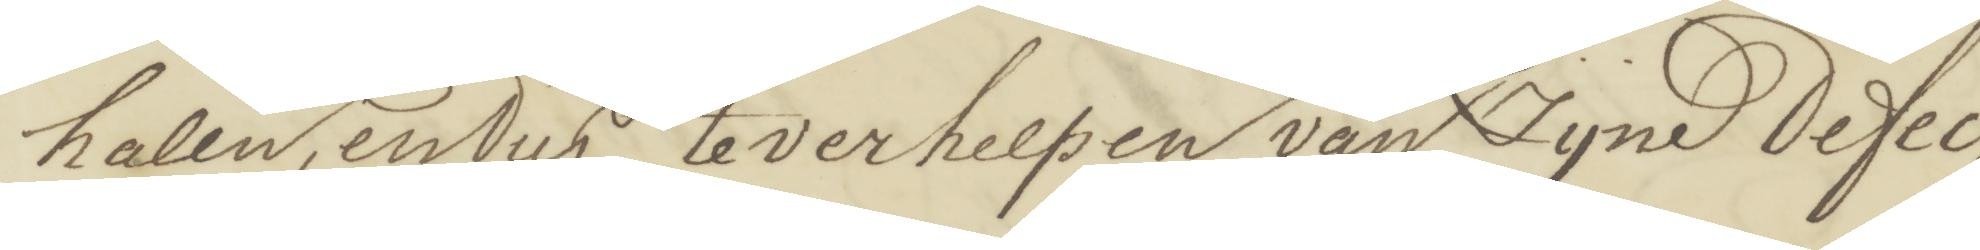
halen, en dus te verhelpen van Zijne defec
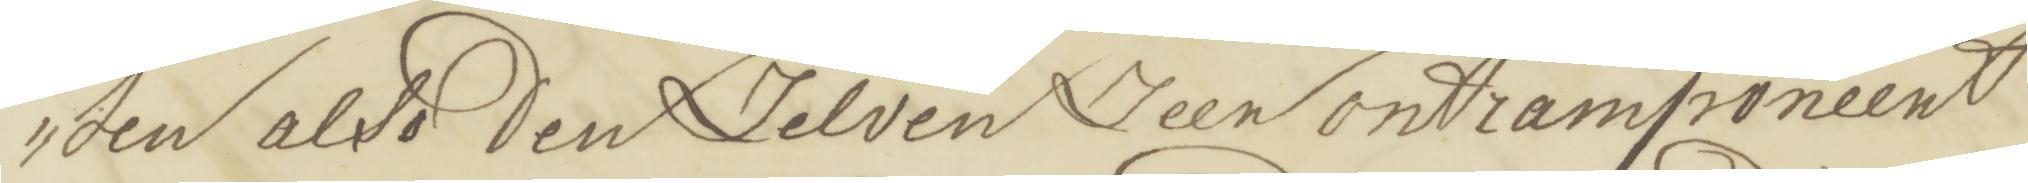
„ten also den Zelven zeer ontramponeert
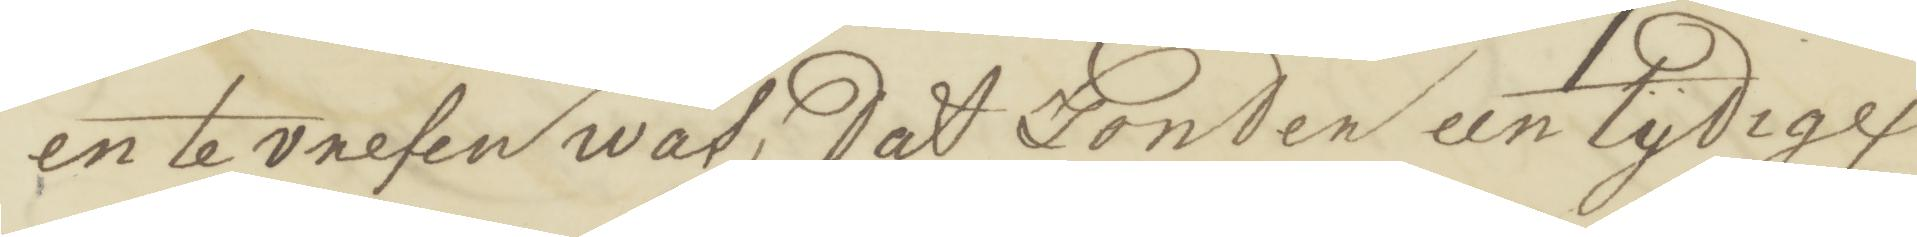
en te vresen was, dat zonder een tijdige
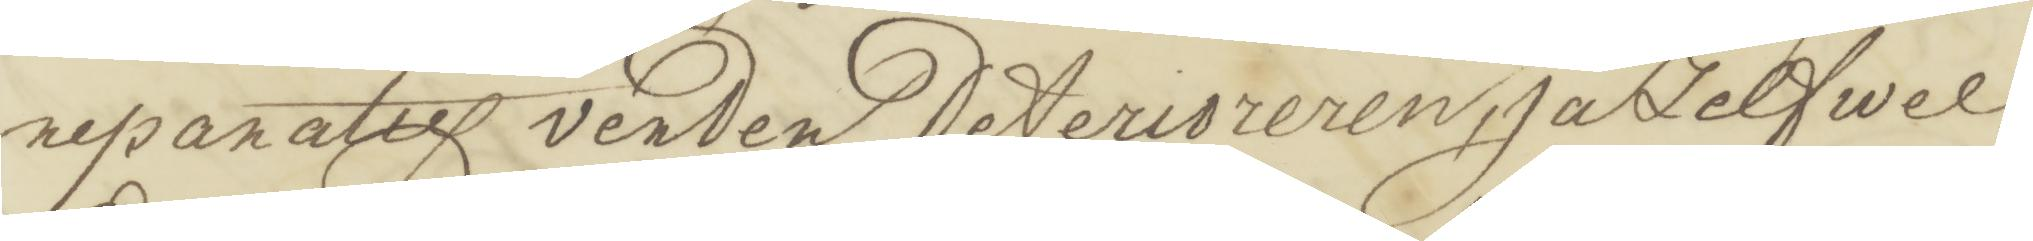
reparatie verder deterioreren, ja zelf wel
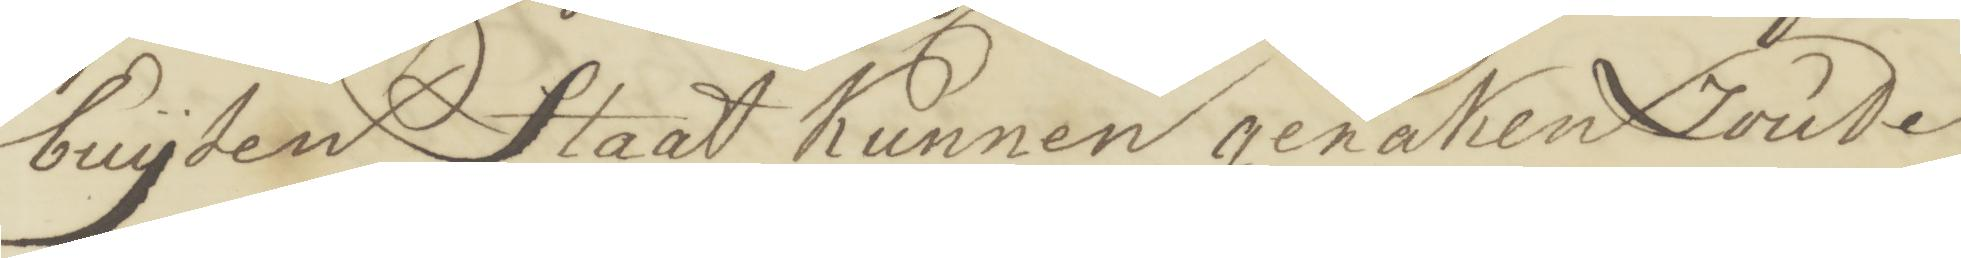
buijten Staat kunnen geraken Zoude,
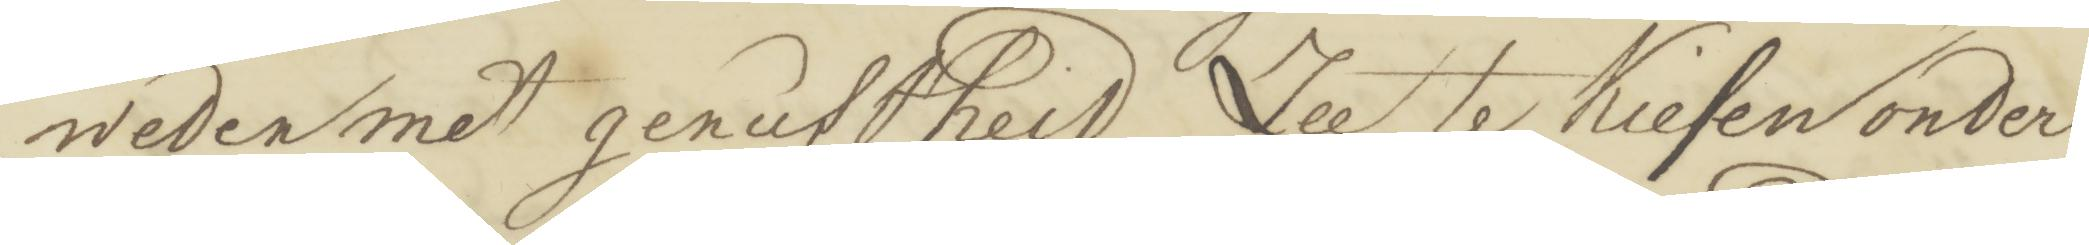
weder met gerustheid Zee te Kiesen onder
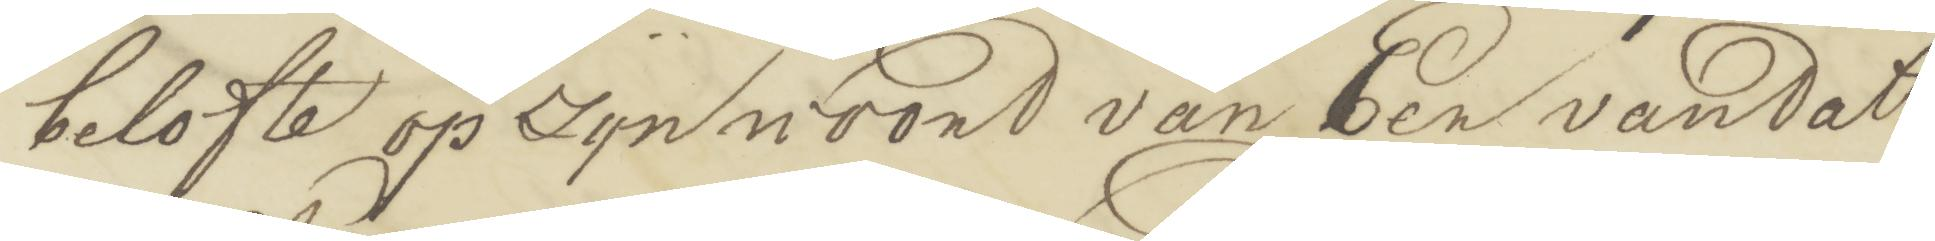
belofte op zijn woord van Eer van dat
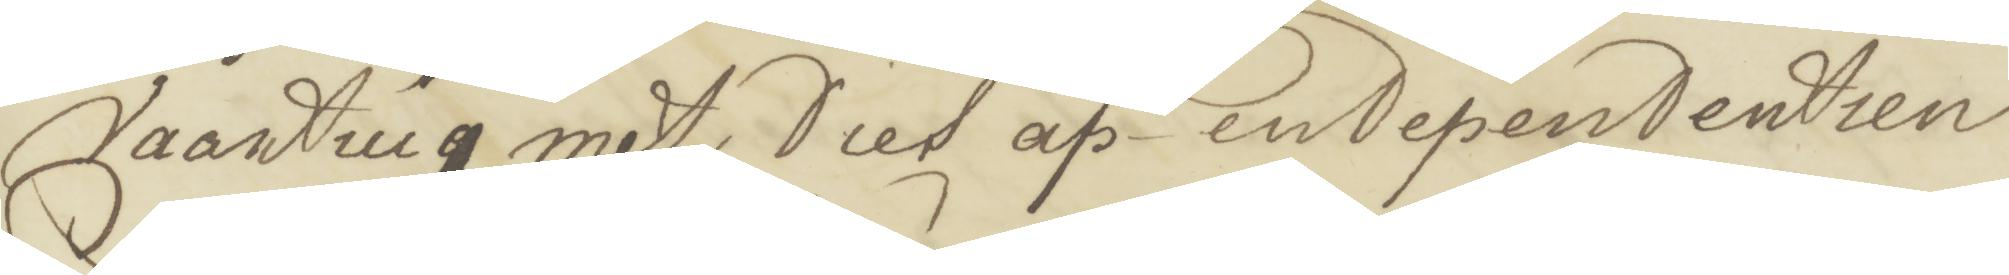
Vaartuig met, dies ap- en dependentien
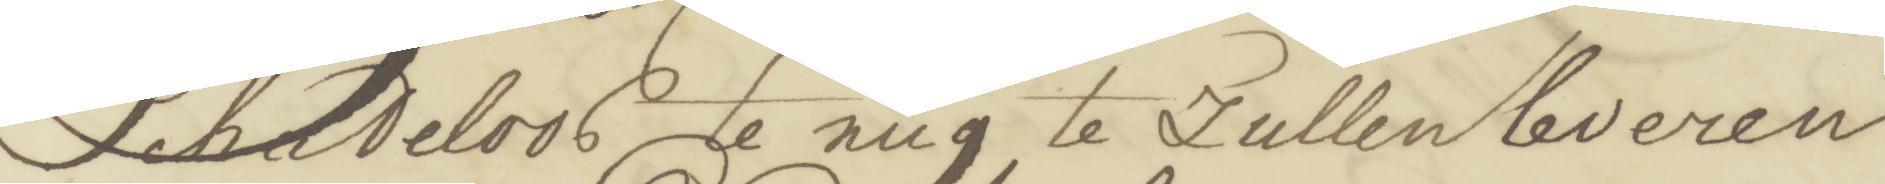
Schadeloos te rug te zullen leveren
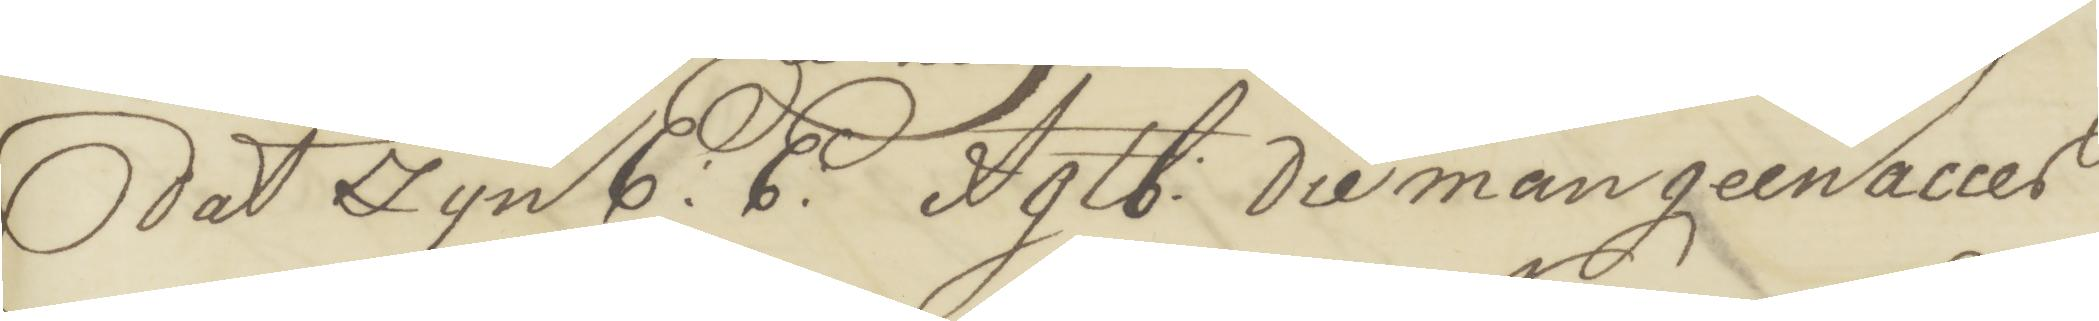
dat zijn E: E: Agtb: die man geen acces
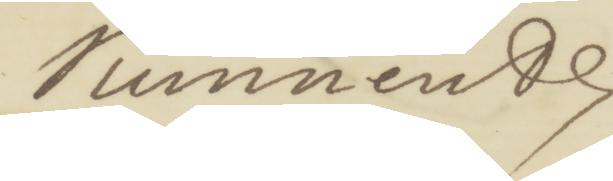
kunnende
